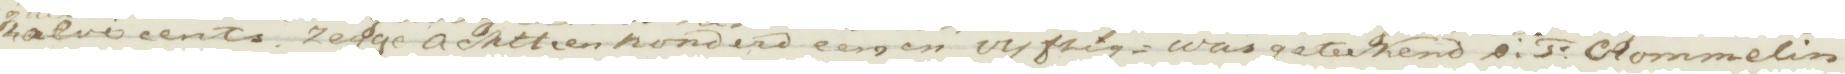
halve cents, zegge achttien honderd een en vyftig = was geteekend D: F: Crommelin
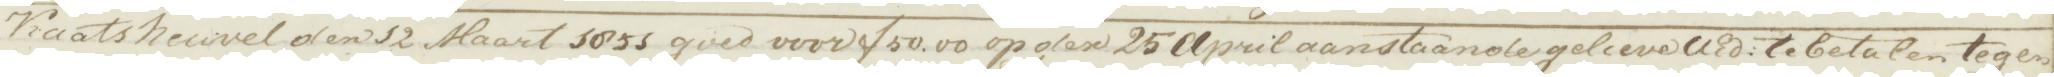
Kaatsheuvel den 12 Maart 1851 goed voor ƒ 50.00 op den 25 April aanstaande gelieve UEd: te betalen tegen
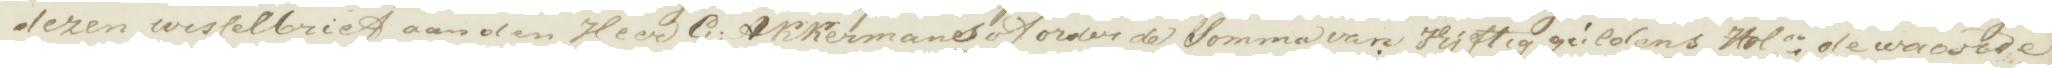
dezen wisselbrief aan den Heer G: Akkermans of order de somma van Vijftig guldens Hol„'' de waarde
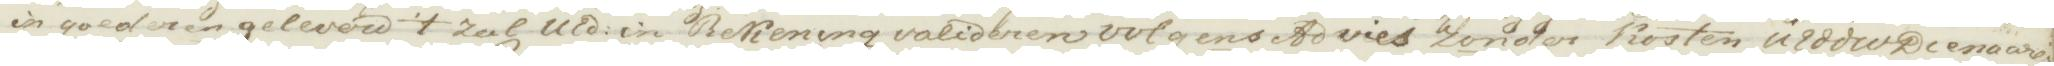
in goederen geleverd ’t zal UEd: in Rekening valideren volgens Advies zonder Kosten uEd dw Dienaaren
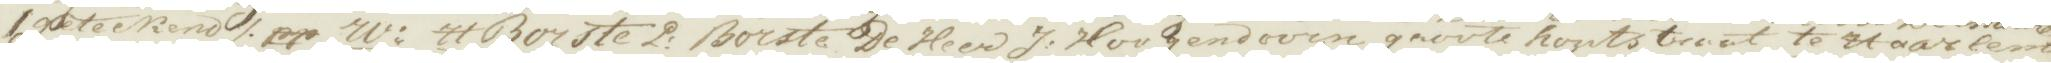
/ geteekend /. pp W: H Borste L: Borste De Heer J: Hoogendoorn groote houtstraat te Haarlem
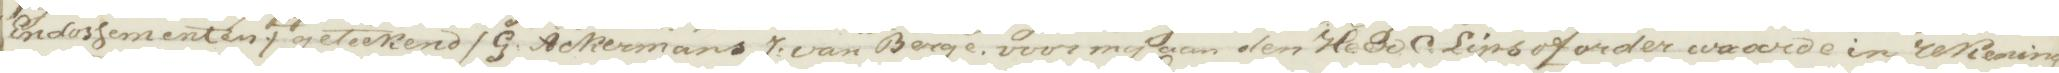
En dossementen ./ geteekend / G: Ackermans J: van Berge, voor my aan den Heer C Lips of order waarde in rekening
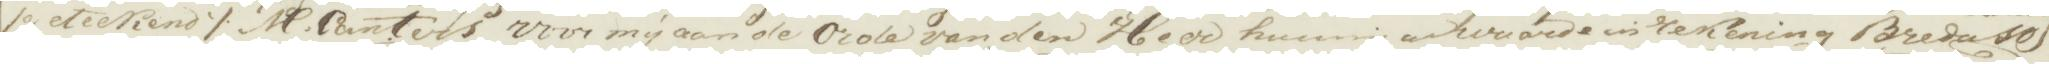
/ geteekend ./. M. Canters voor mij aan de Orde van den Heer hunnij a waarde in rekening Breda 10
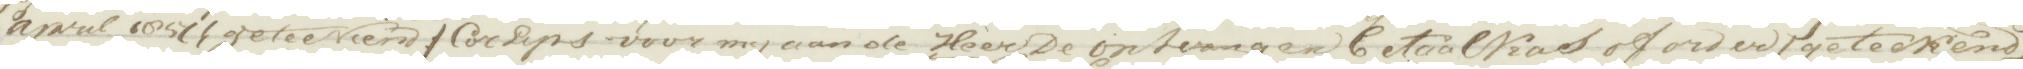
April 1851 / geteekend / Cor Lips voor my aan de Heer De ontvangen betaalkas of order / geteekend
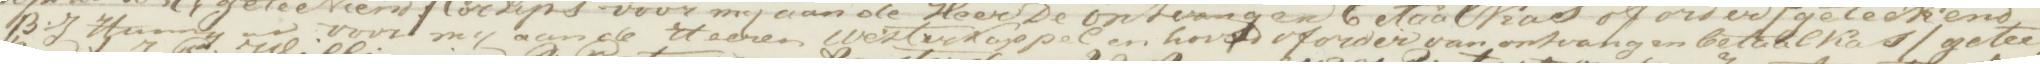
B: J Hunny na voor my aan de Heeren westerkappel en hoofd of order van ontvangen betaalkas / getee
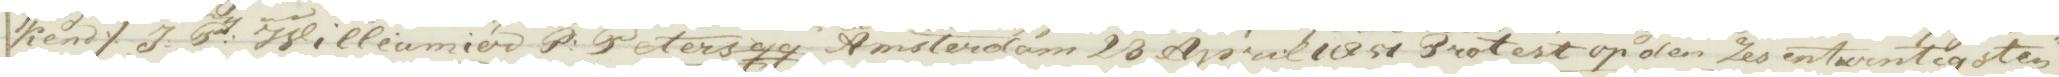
kend ./. J: P: Willeamier P: Peters qq Amsterdam 23 April 1851 Protest op den zes en twintigsten
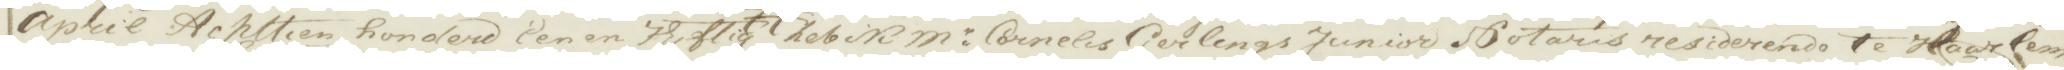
April Achttien honderd Een en Vyftig heb ik m„r Cornelis Gerlings Junior Notaris residerende te Haarlem
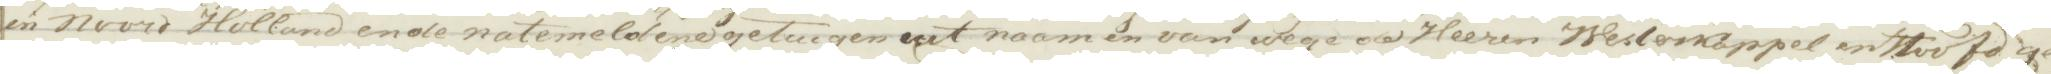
in Noord Holland en de natemeldene getuigen uit naam en van wege de Heeren Westerkappel en Hoofd ge
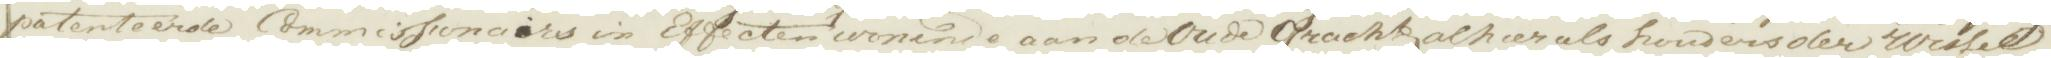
patenteerde Commissionairs in Effecten wonende aan de Oude Gracht alhier als houders der wissel
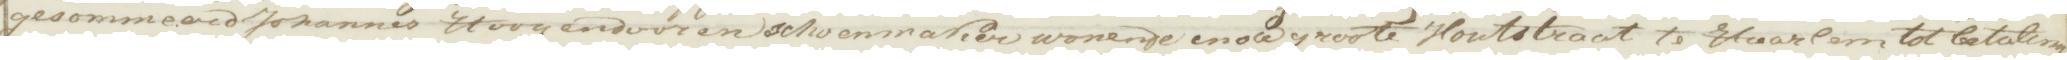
gesommeerd Johannes Hoogendooren schoenmaker wonende in de groote Houtstraat te Haarlem tot betaling
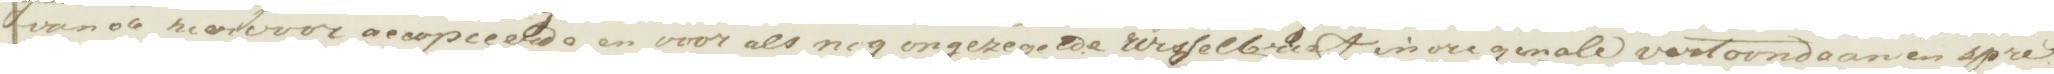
van de hiervoor gecopieerde en voor als nog ongezegelde wisselbrief in originale vertoond aan en spre
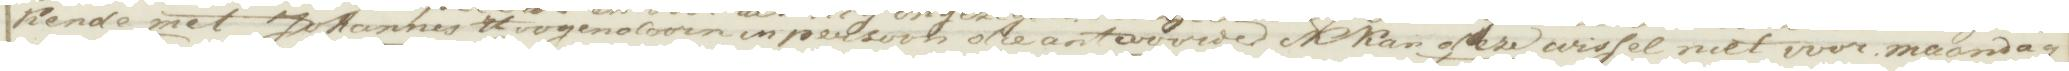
kende met Johannes Hoogendoorn in persoon de antwoorde ik Kan deze wissel niet voor maandag
